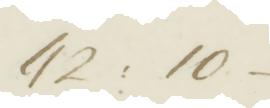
42: 10 —
